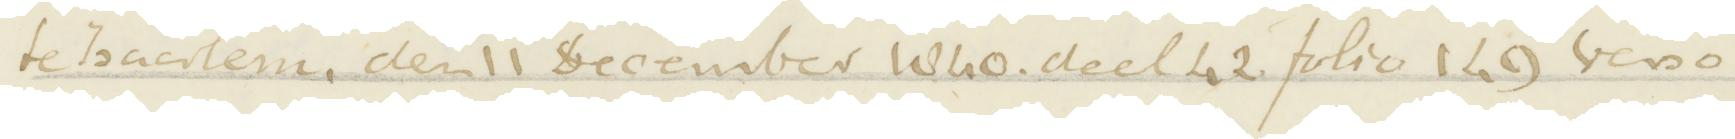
te haarlem den 11 december 1840. deel 42 folio 149 verso
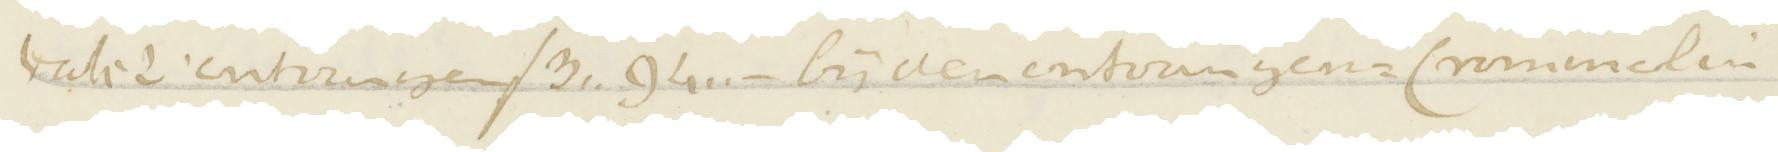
Vak 2 ontvangen ƒ3„ 94„ - bij den ontvanger: Crommelin
